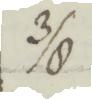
3/8
